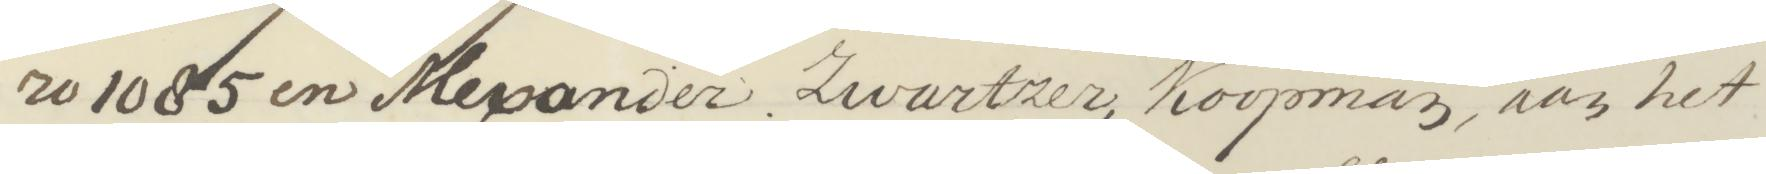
ro 1085 en Alexander . Zwartzer, Koopman, aan het
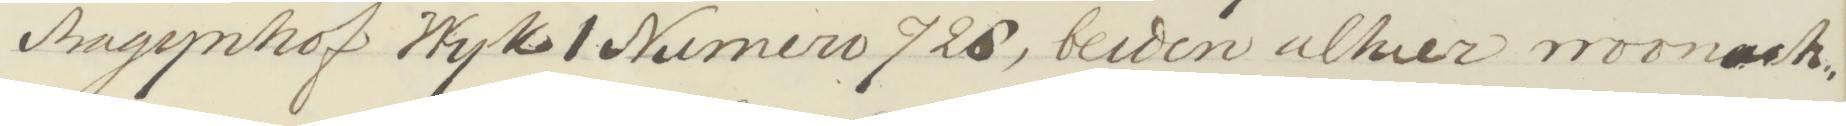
Bagynhof Wyk 1 Numero 728, beiden alhier woonach,
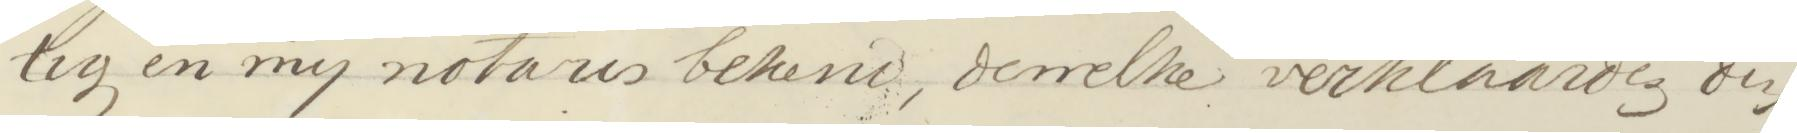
tig en my notaris bekend, dewelke verklaarden den
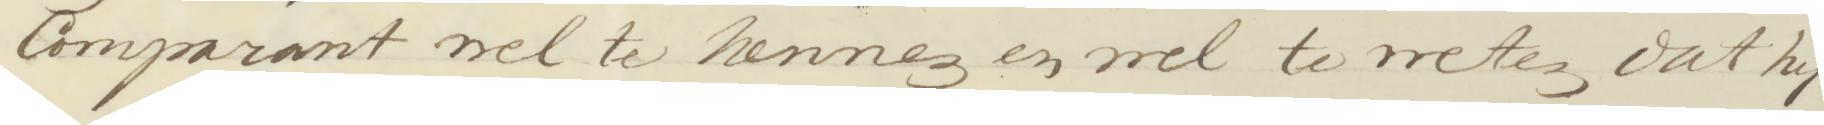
Comparant wel te kennen en wel te weten dat hy
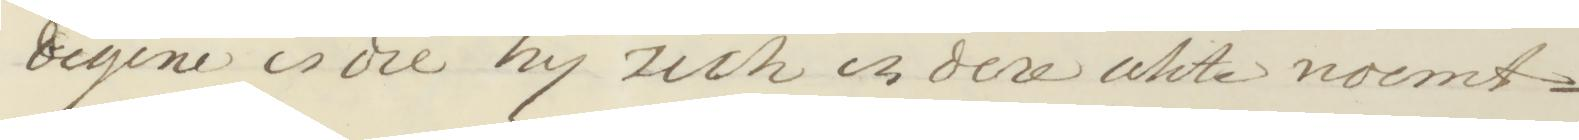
degene is die hij zich in deze akte noemt-
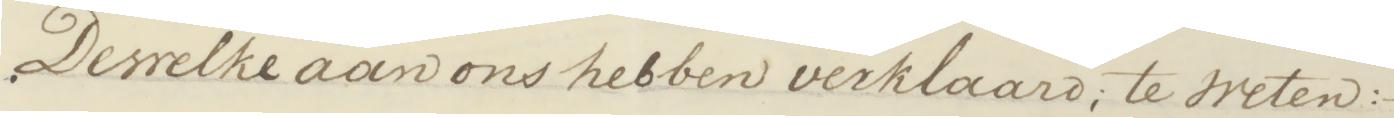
Dewelke aan ons hebben verklaard; te weten:
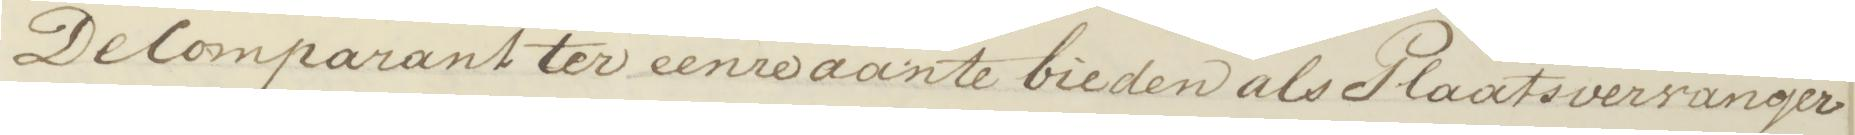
De Comparant ter eenre aante bieden als Plaatsvervanger
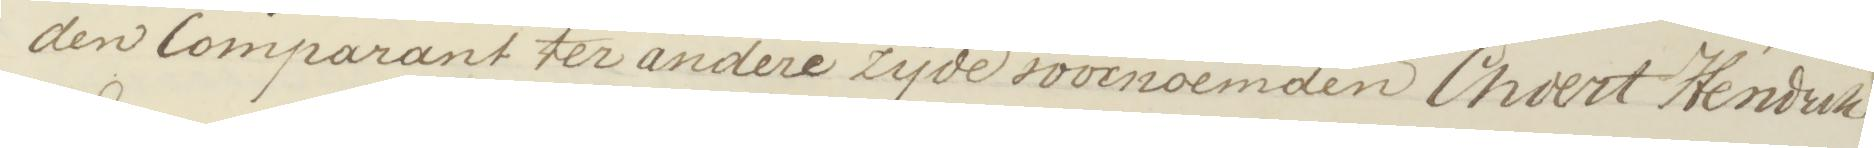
den Comparant ter andere zijde voornoemden Choert Hendrik
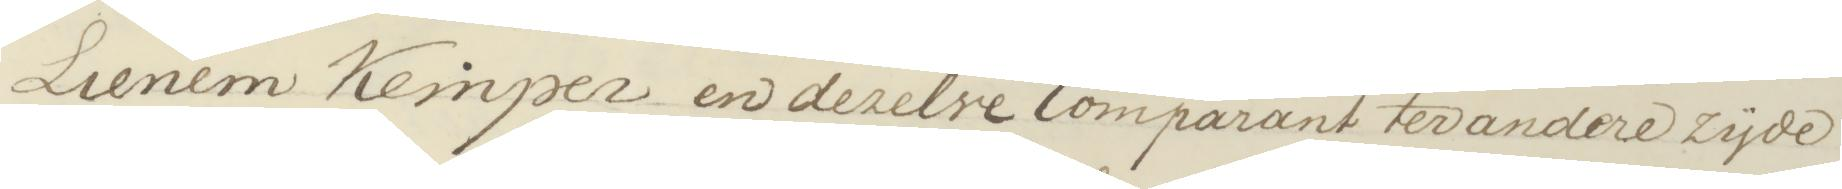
Lienem Kemper en dezelve Comparant ter andere zijde
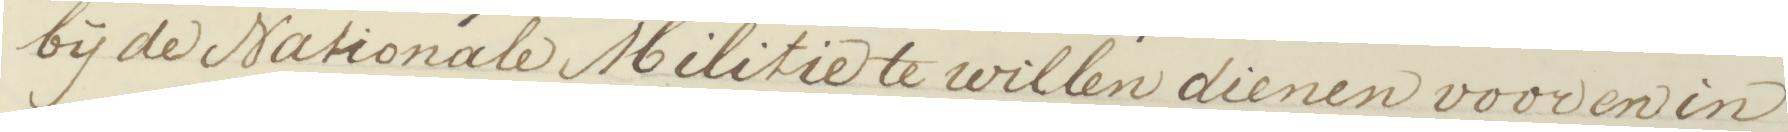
bij de Nationale Militie te willen dienen voor en in
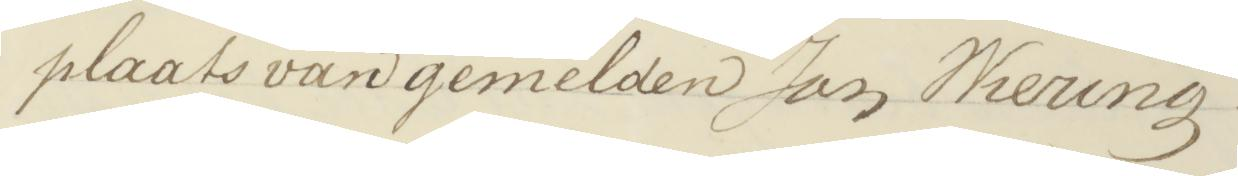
plaats van gemelden Jan Wiering
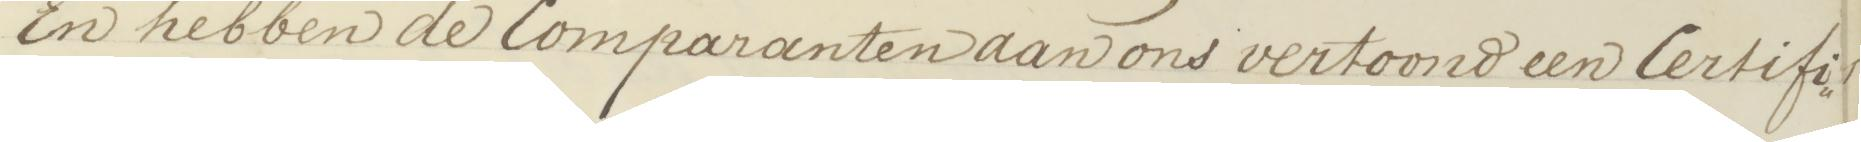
En hebben de Comparanten aan ons vertoond een Certifi„
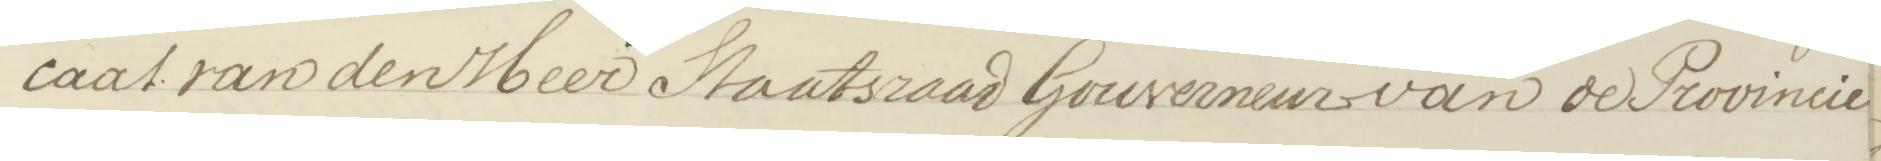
caat van den Heer Staatsraad Gouverneur van de Provincie
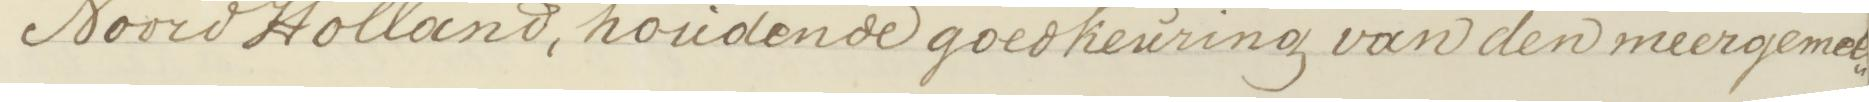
Noord Holland, houdende goedkeuring van den meergemel„
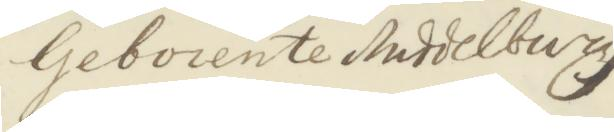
Geboren te Middelburg
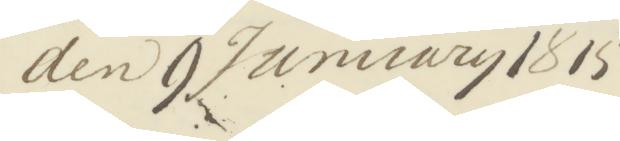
den 9 January 1815
